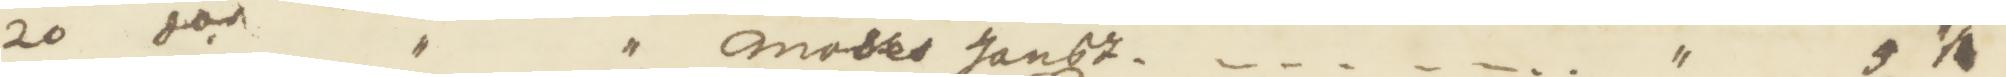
20 d:os „ „ moses Jansz - - - - - - - . . „ 5 1/4
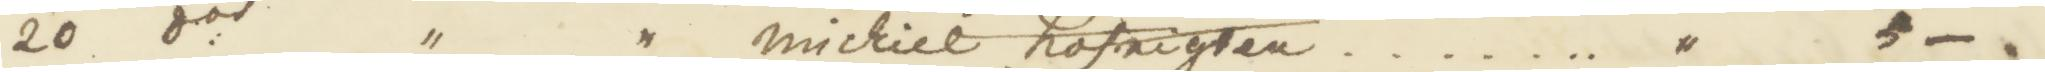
20 d:os „ „ michiel hofrigter . . . . . . . „ 5 —
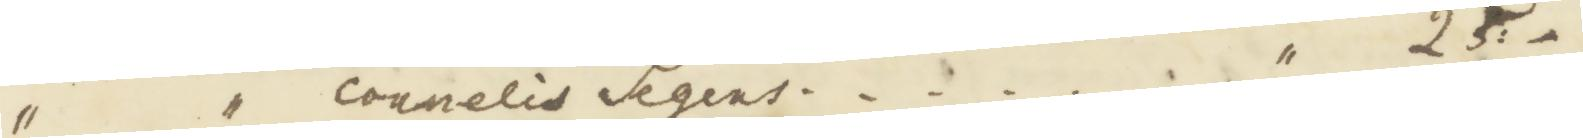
„ „ cornelis segers . . . . . . . . . „ 25: —
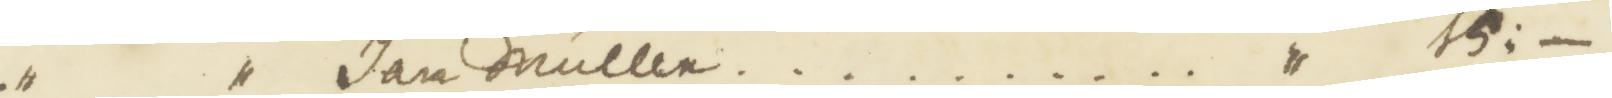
„ „ Jan Muller . . . . . . . . . . „ 15: —
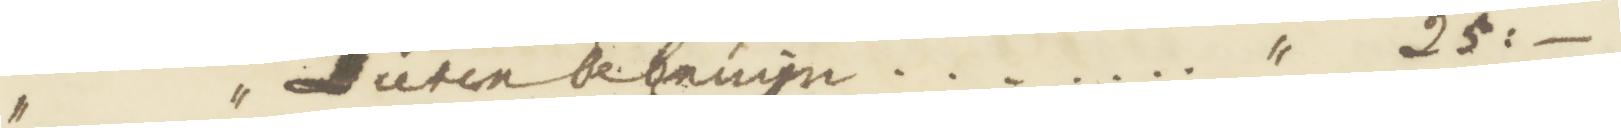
„ „ Pieter de bruijn . . . . . . . „ 25: —
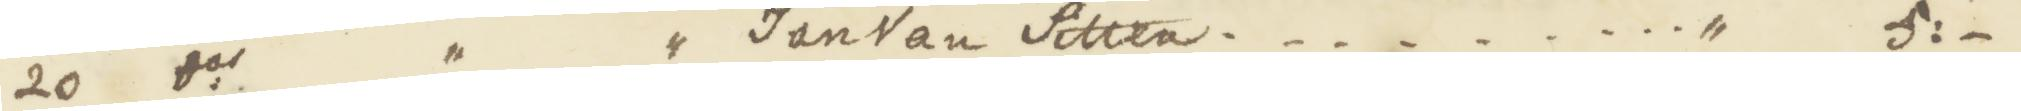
20 d:os „ „ Jan van Sitter . . . . . . . . . „ 5: —
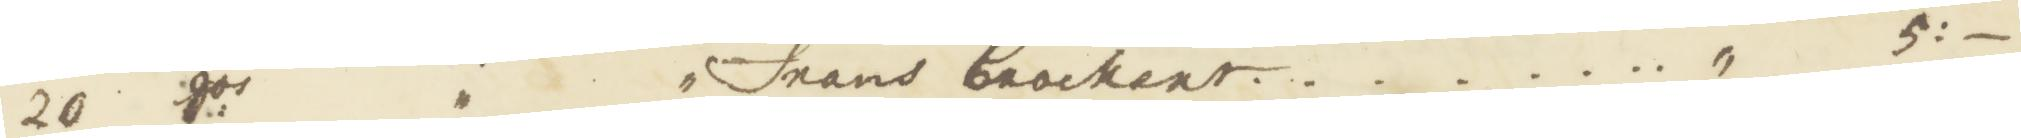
20 d:os „ „ frans brockert . . . . . . . . „ 5: —
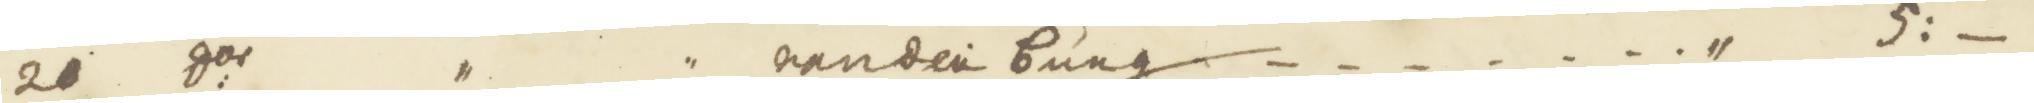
20 d:os „ „ van der burg - - - . . . . „ 5: —
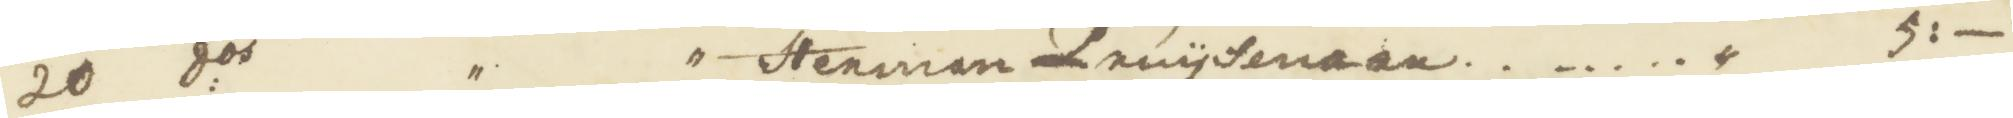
20 d:os „ „ Herman Pruijsenaar . . . . . . . „ 5: —
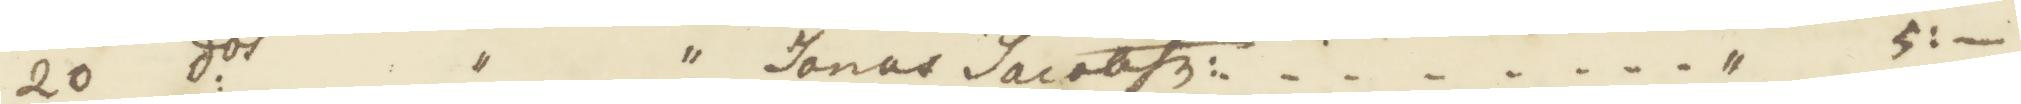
20 d:os „ „ Jonas Jacobsz: . . . . . . . „ 5: —
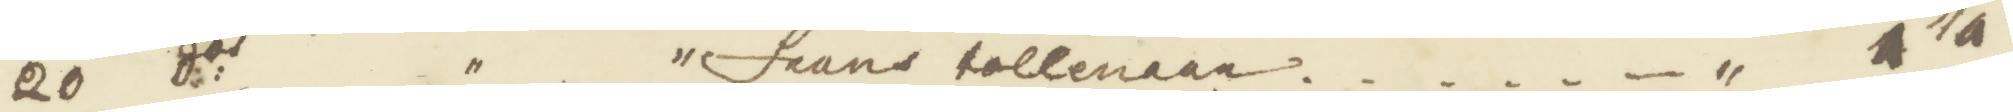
20 d:os „ „ frans tollenaar . . . . . - „ 4 3/4
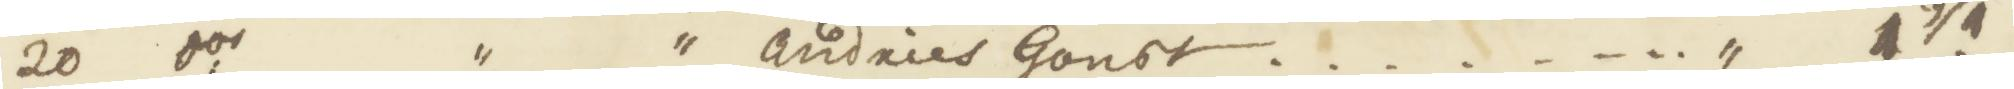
20 d:os „ „ andries Gonst . . . . . - . . „ 4 3/4
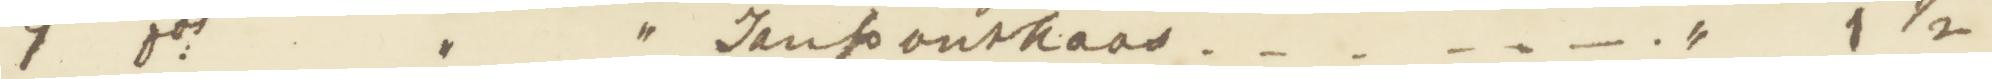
7 d:os „ „ Jan pontkaas . - . - . - .„ 1 1/2
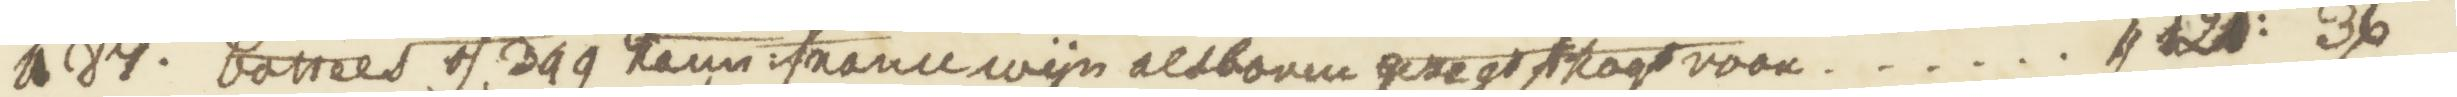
487. bottels of 349 kann: france wijn alsboven gezegt verkogt voor . . . . . . „ 121: 36
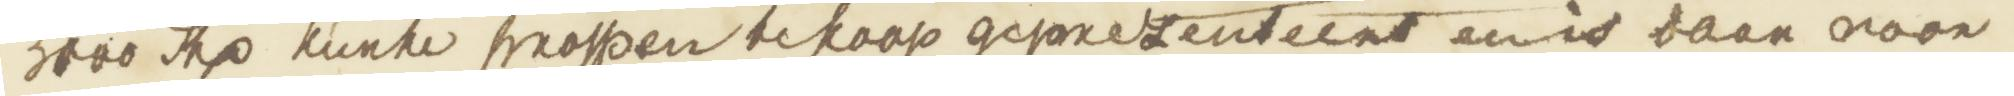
3000 stx kurte proppen te koop geprezenteert en is daar voor
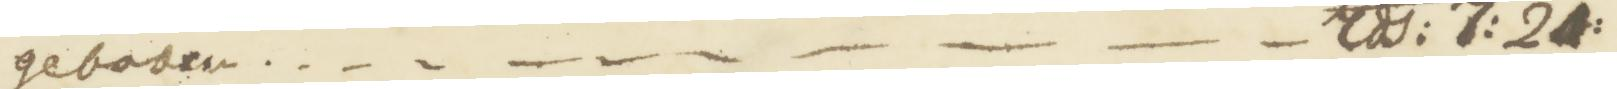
geboden . . - - - - - - - - - rds: 7: 24:
